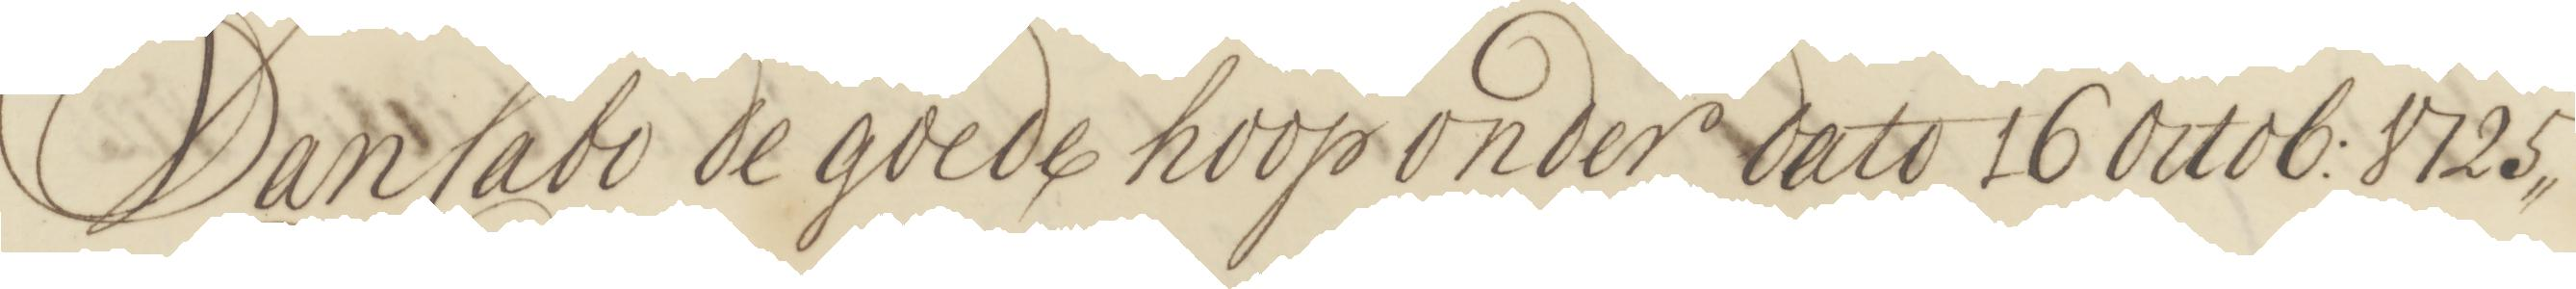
Van Cabo de goede hoop onder dato 16 Octob: 1725„
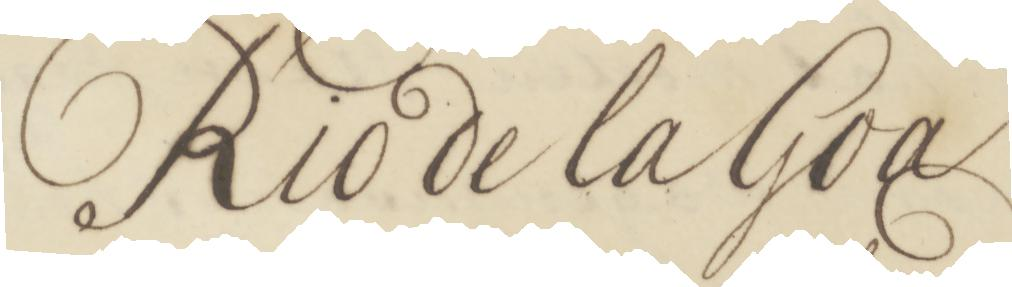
Rio de la Goa
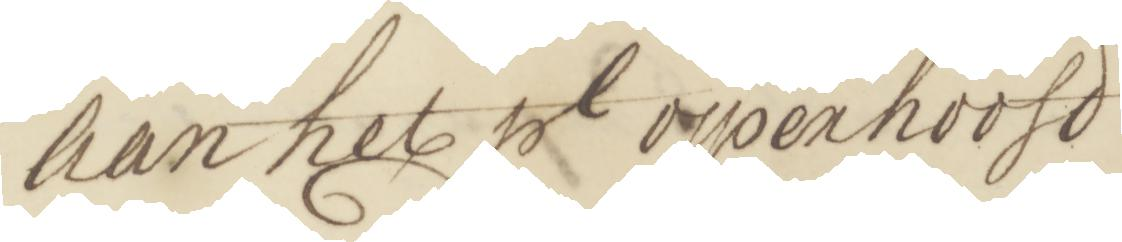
aan het pl opperhoofd
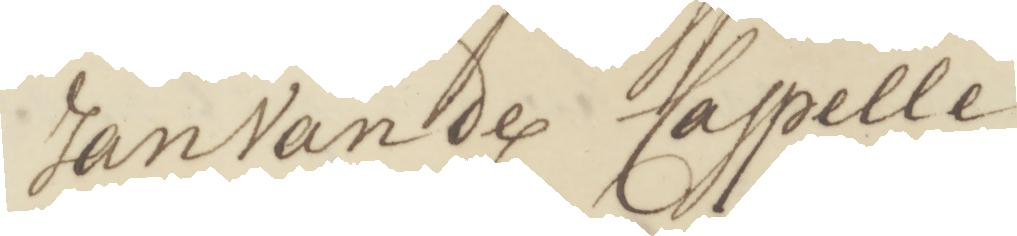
Ian Van de Cappelle
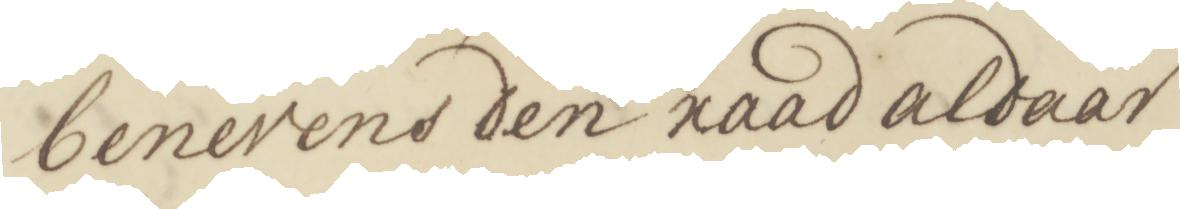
benevens den raad aldaar
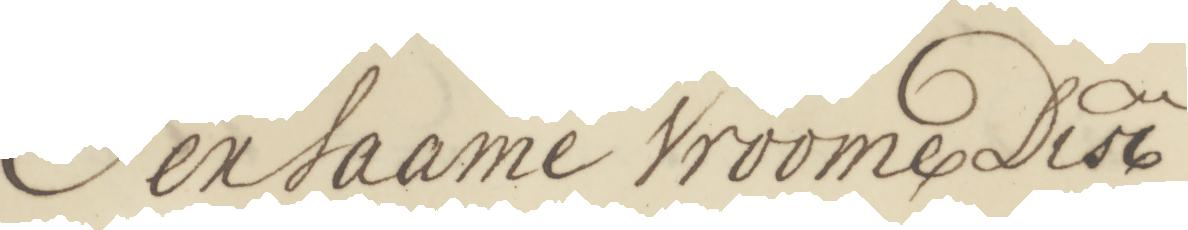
Eersaame Vroome Disc
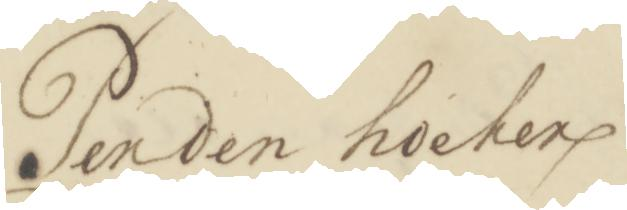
Per den hoeker
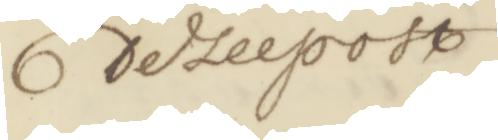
de zeepost
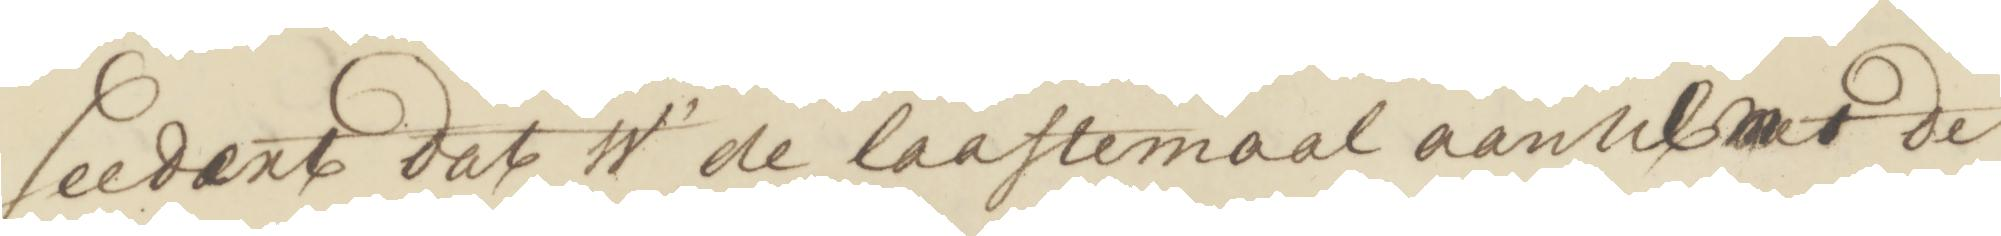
seedert dat w' de laastemaal aan uE met de
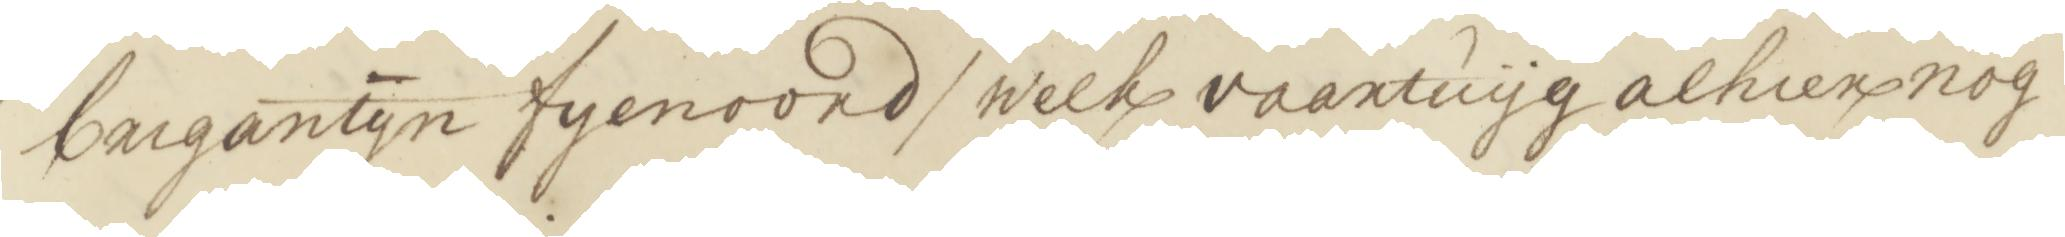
brigantijn fyenoord / welk vaartuijg alhier nog
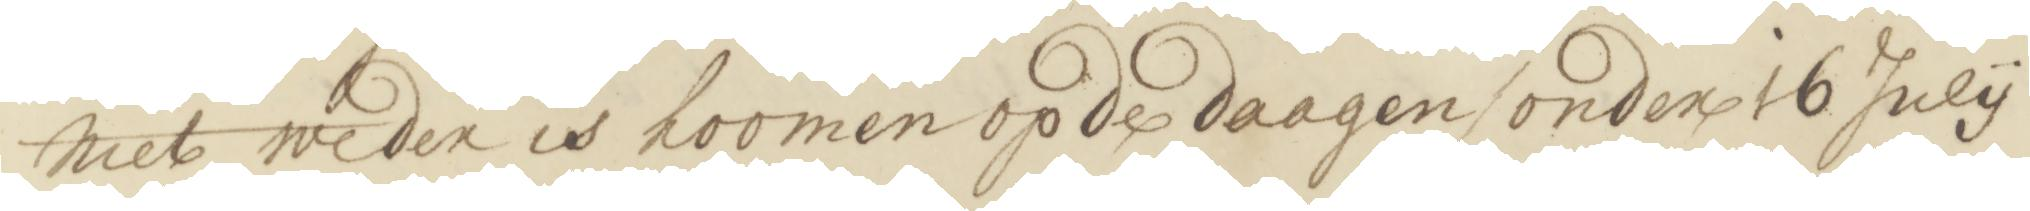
niet weder is koomen op de daagen / onder 16 Julij
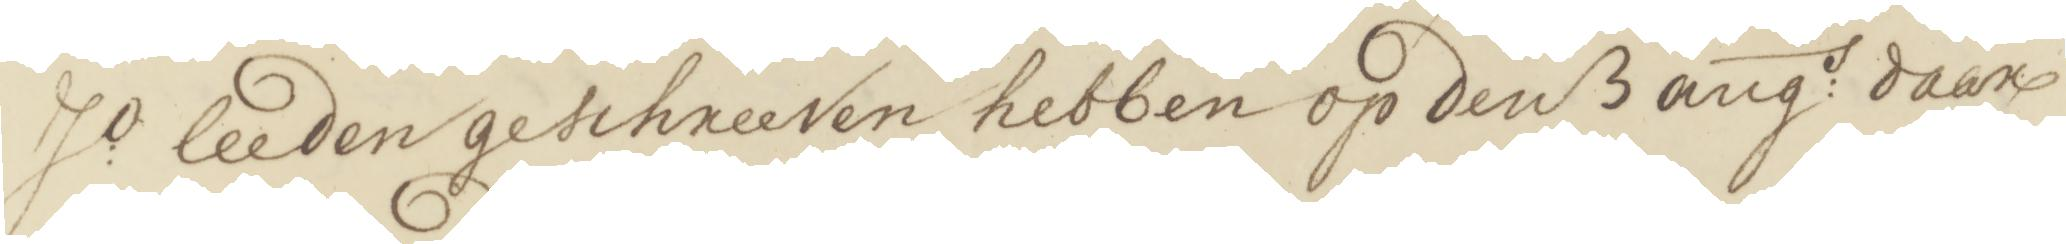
J:o leeden geschreeven hebben op den 3 aug:s daar
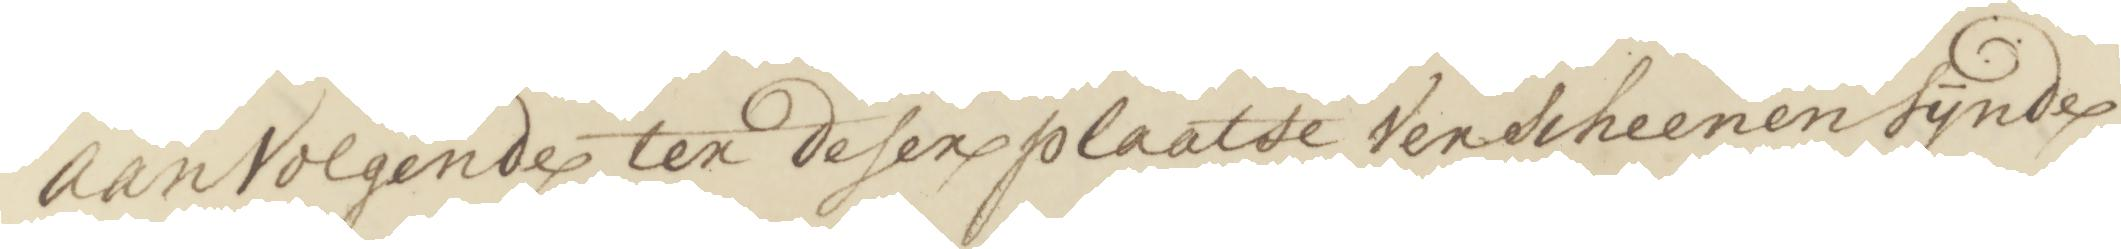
aanvolgende ter deser plaatse verscheenen sijnde
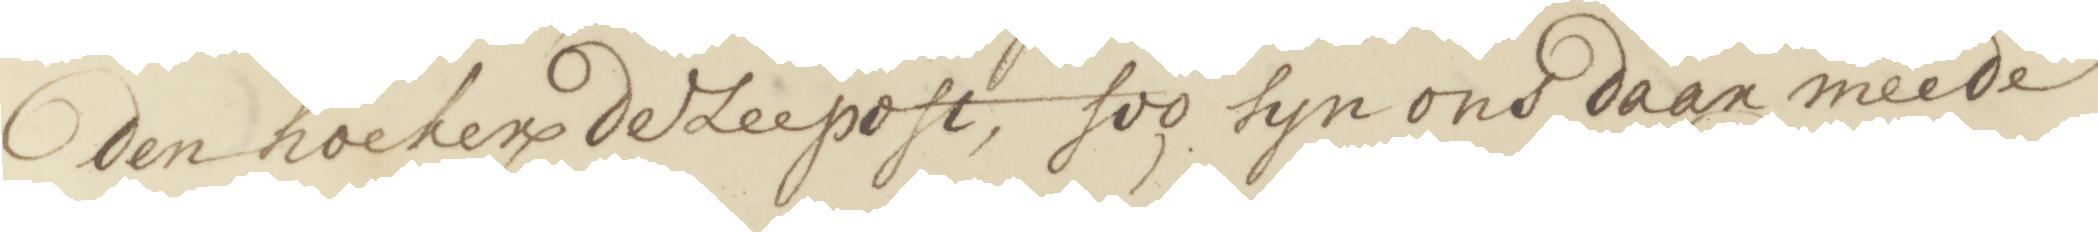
den hoeker de zeepost, soo syn ons daar meede
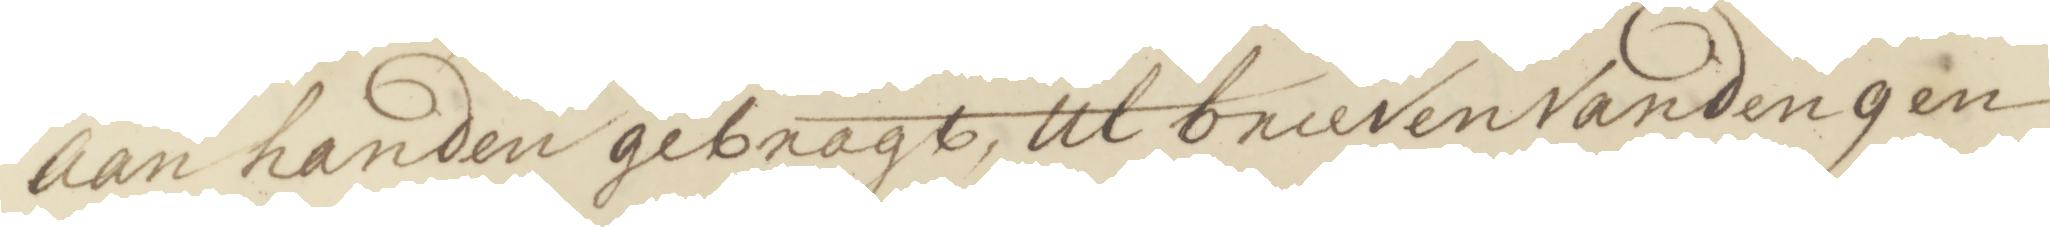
aan handen gebragt, ul brieven van den 9 en
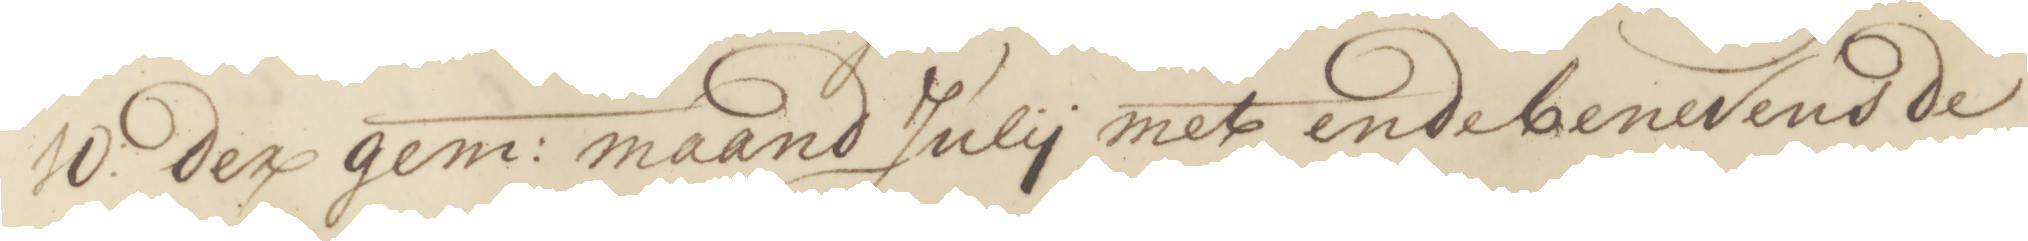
10: der gem: maand Julij met ende benevens de
